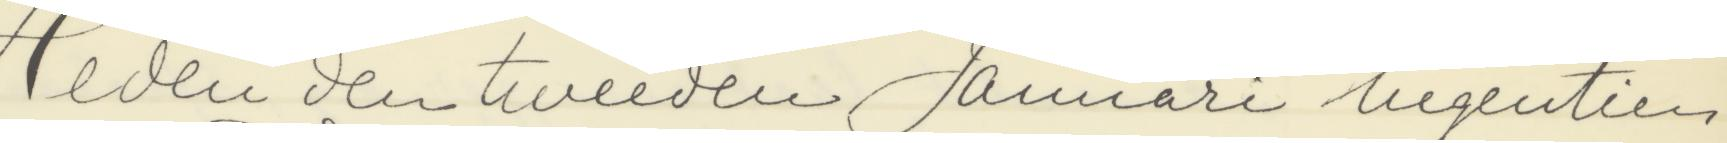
Heden den tweeden Januari negentien
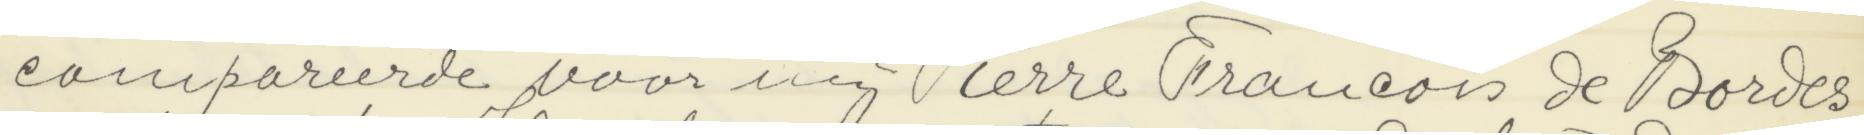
compareerde voor mij Pierre Francois de Bordes,
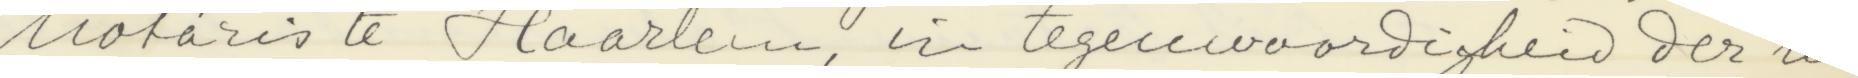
notaris te Haarlem, in tegenwoordigheid der na
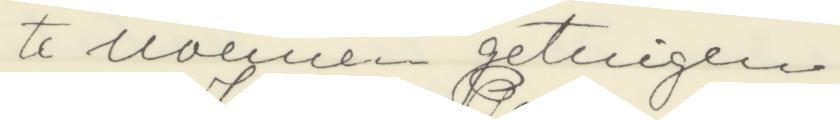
te noemen getuigen
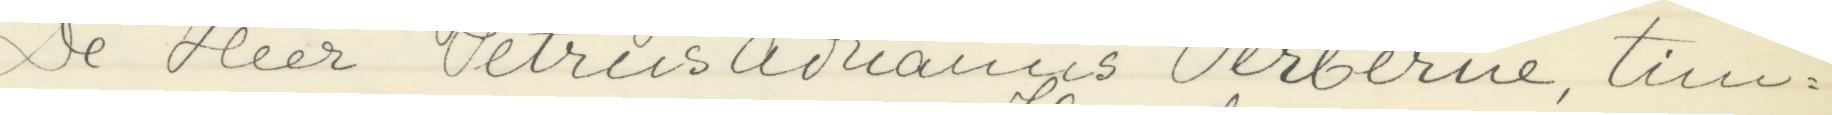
De Heer Petrus Adrianus Verberne, tim=
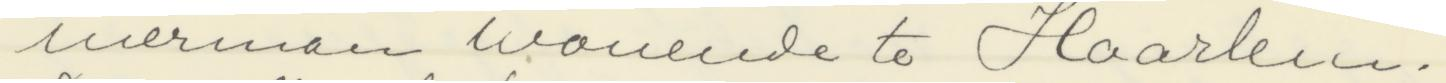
merman wonende te Haarlem.
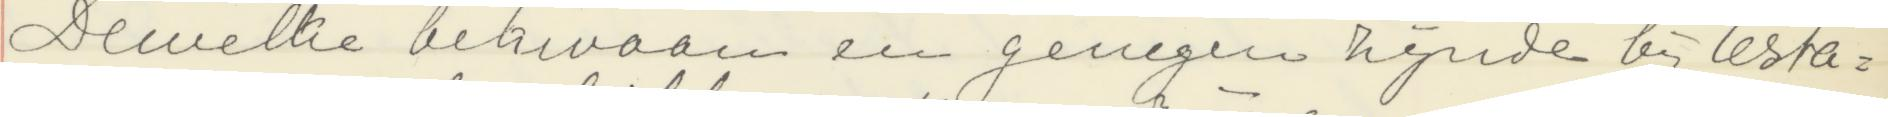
Dewelke bekwaam en genegen zijnde bij testa=
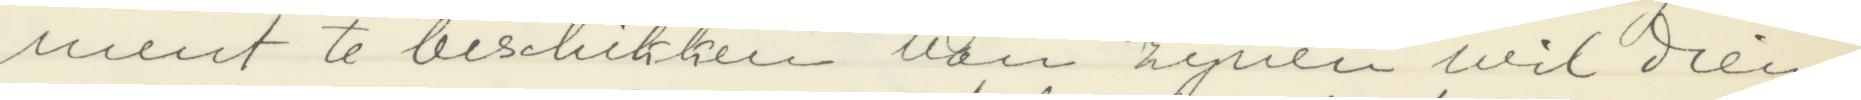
ment te beschikken van zynen wil dien=
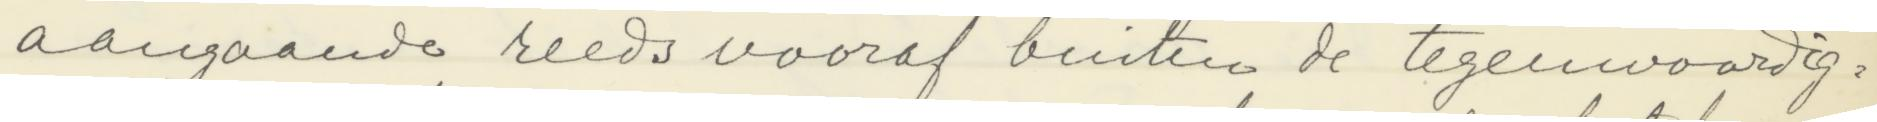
aangaande reeds vooraf buiten de tegenwoordig=
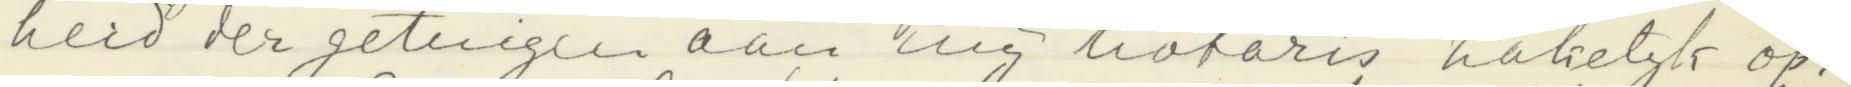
heid der getuigen aan mij notaris zakelijk op=
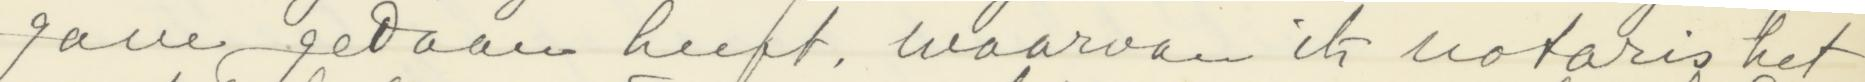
gave gedaan heeft, waarvan ik notaris het
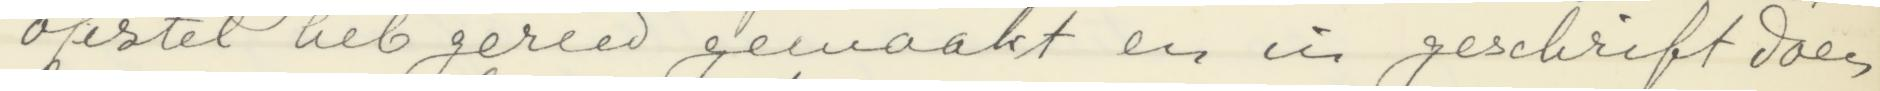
opstel heb gereed gemaakt en in geschrift doen
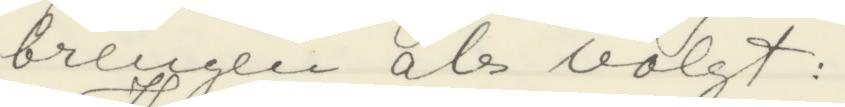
brengen als volgt:
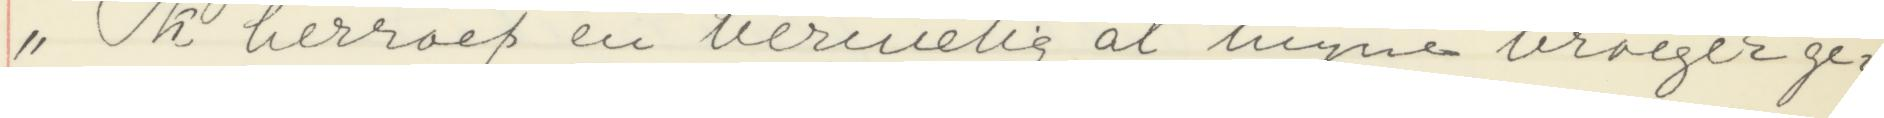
„ Ik herroep en vernietig al mijne vroeger ge=
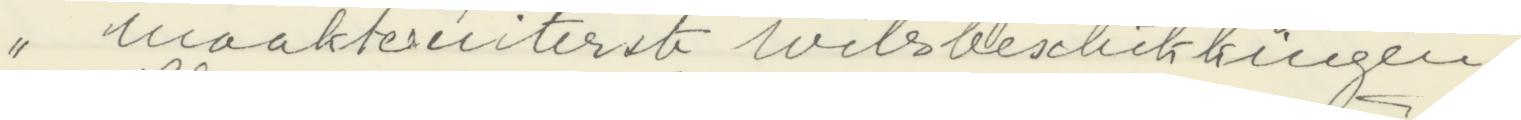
„ maakte uiterste wilsbeschikkingen
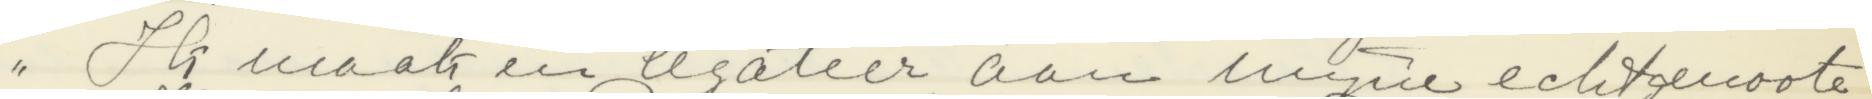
„ Ik maak en legateer aan mijne echtgenoote
